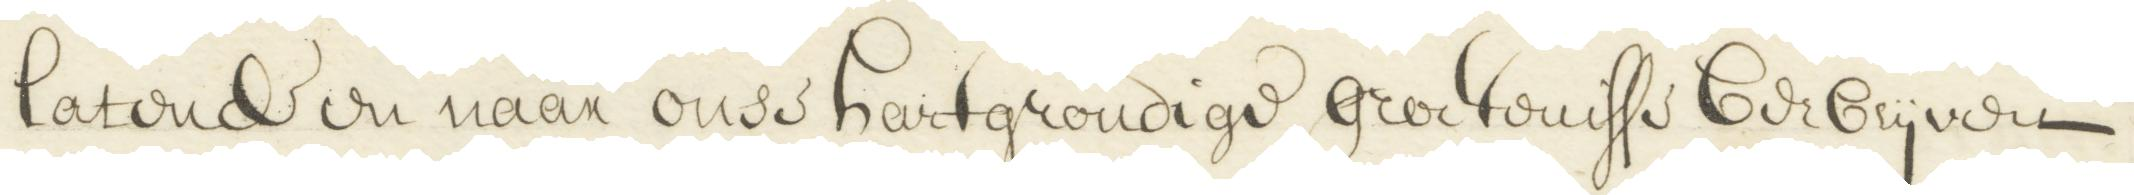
latende en naar onse hartgrondige groetenisse berblijven
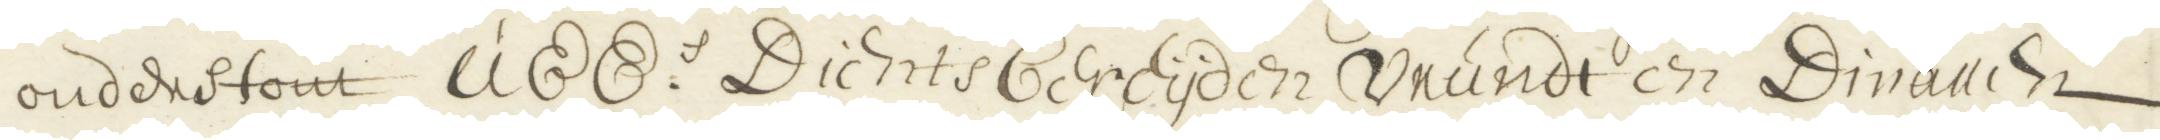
onderstont UEE:s Dients bereijden vrundt en Dinaren
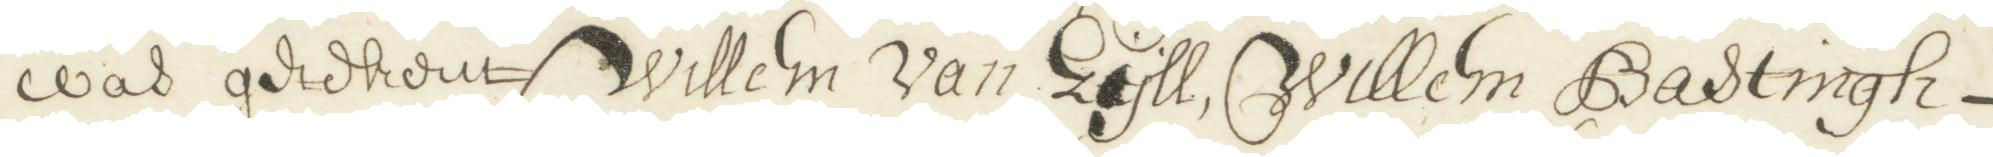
was getekent Willem van Zijll, Willem Bastingh —
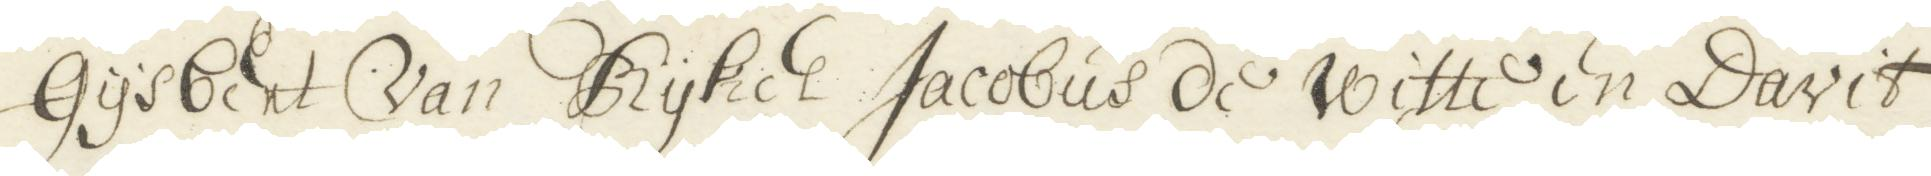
Gijsbert van Rijkel Jacobus de witte en Davit
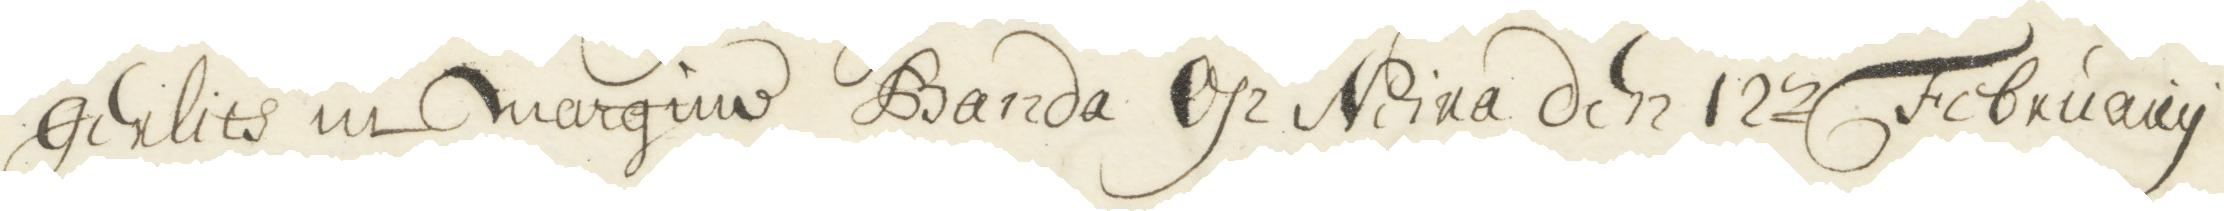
gerlits in margine Banda Op Neira den 12=en Februarij
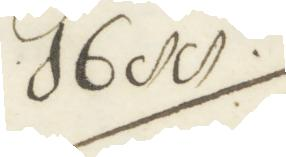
1688.
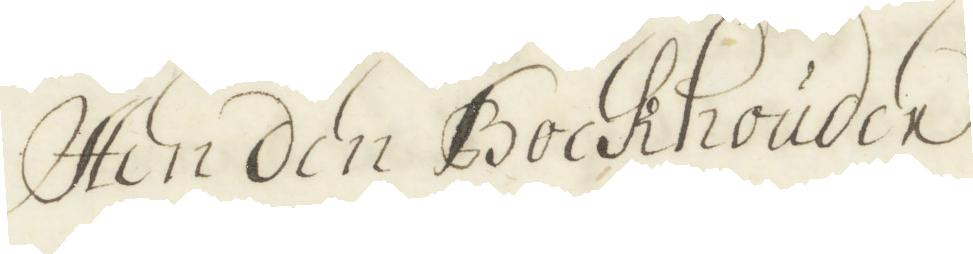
Aen den Boekhouder
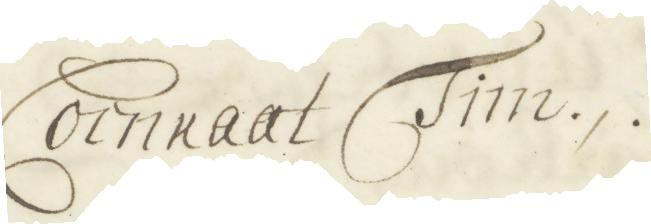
Coenraat Tim./ .
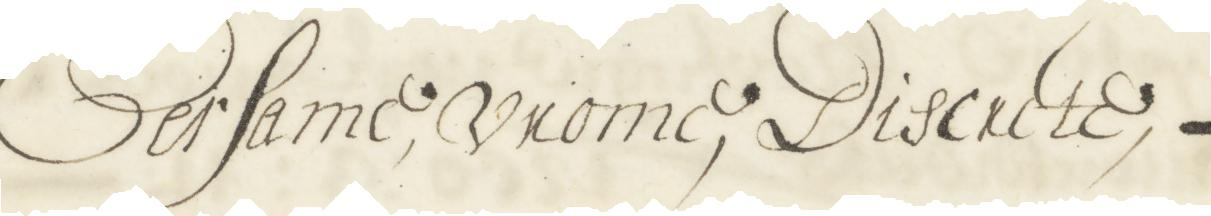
Eersame, vrome, Discrete, -
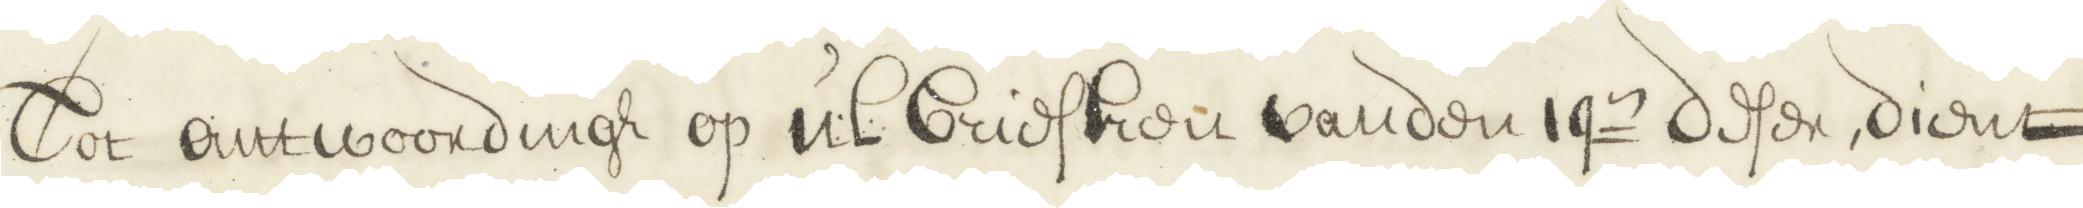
Tot antwoordingh op u:l: briefken van den 19=en deser, dient
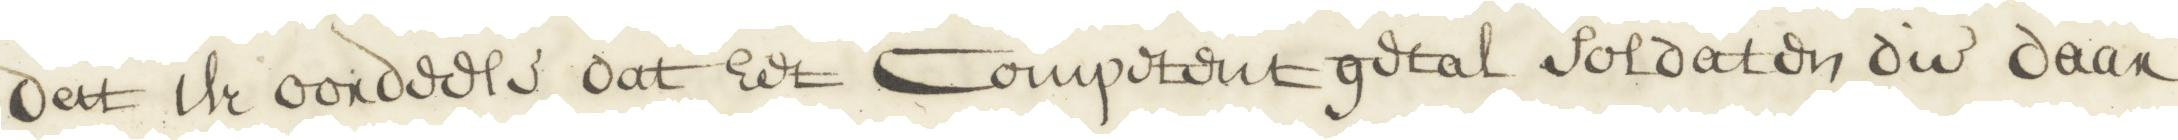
dat ik oordeele dat het Competent getal soldaten die daar
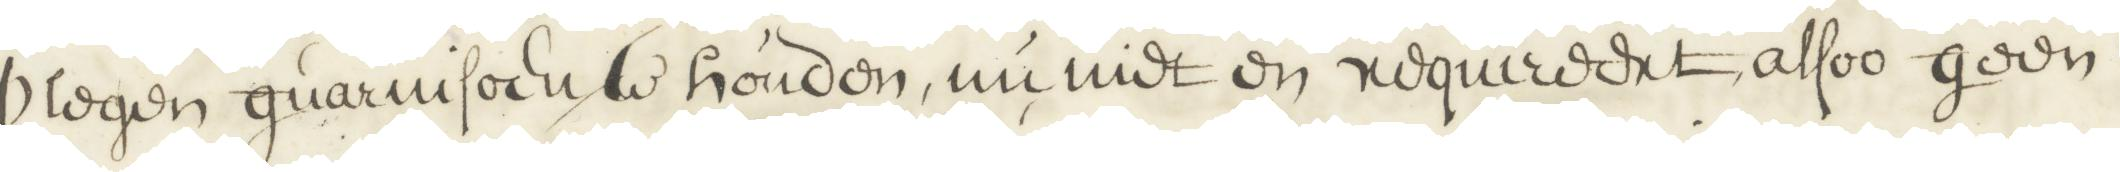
plegen guarnisoen te houden, nu niet en requireert, alsoo geen
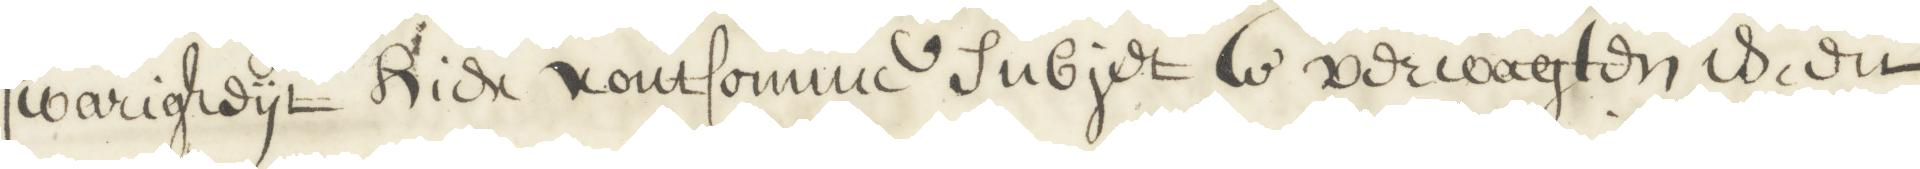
warigheijt hier rontsomme subjet te verwagten is, en
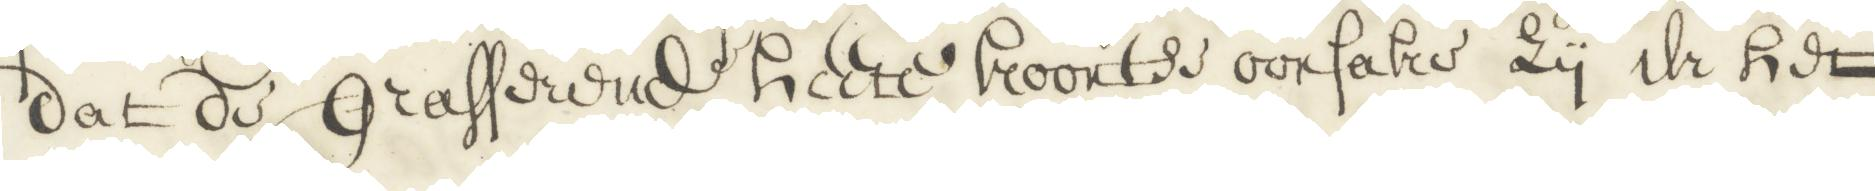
dat de grasserende heete koortse oorsake zij ik het
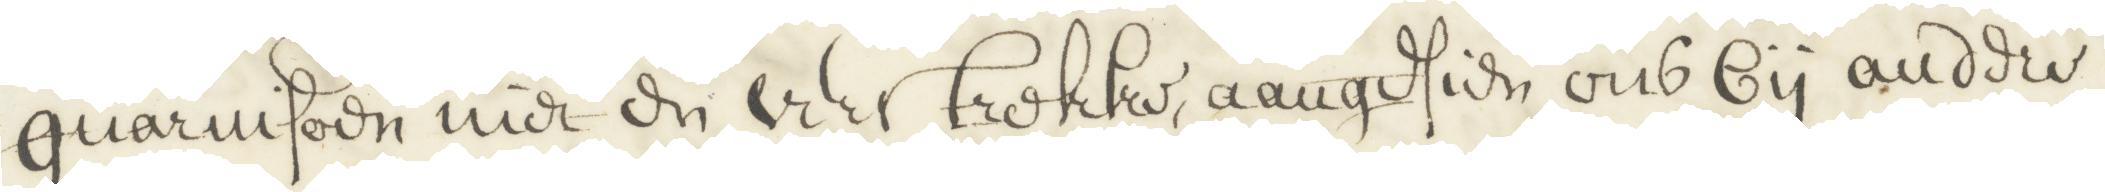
guarnisoen niet en verstrekke, aangesien ons bij andere
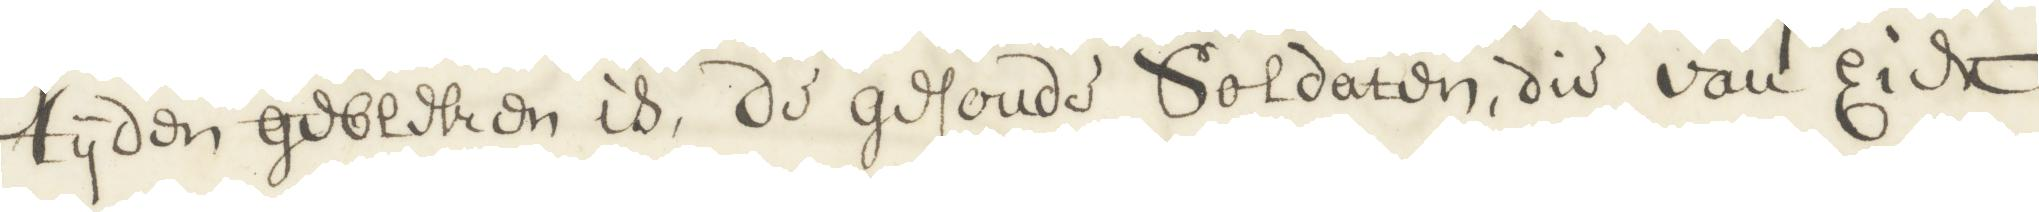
tijden gebleken is, de gesonde soldaten, die van hier
